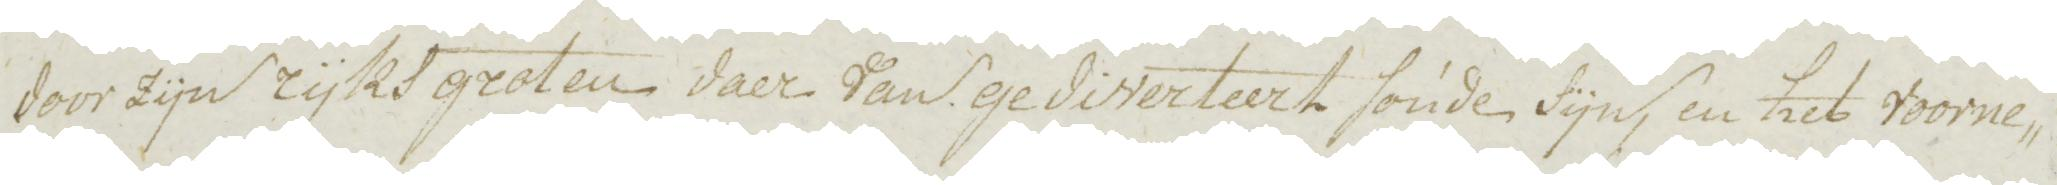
door zijn rijks groten daer van gediverteert soude sijn, en het voorne„
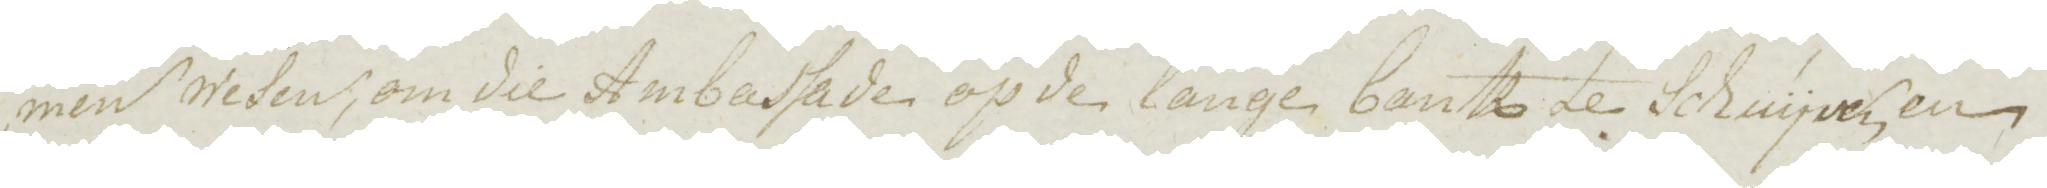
men wesen, om die Ambassade op de lange bank te schuijven en
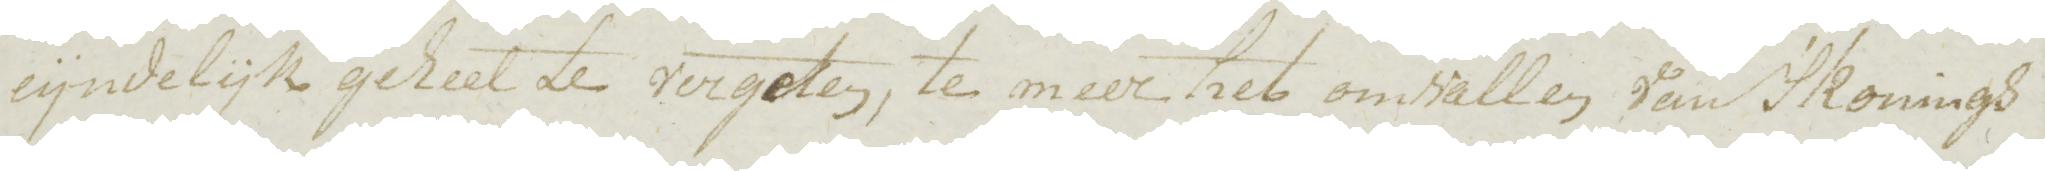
eijndelijk geheel te vergeten, te meer het omvallen van 's Konings
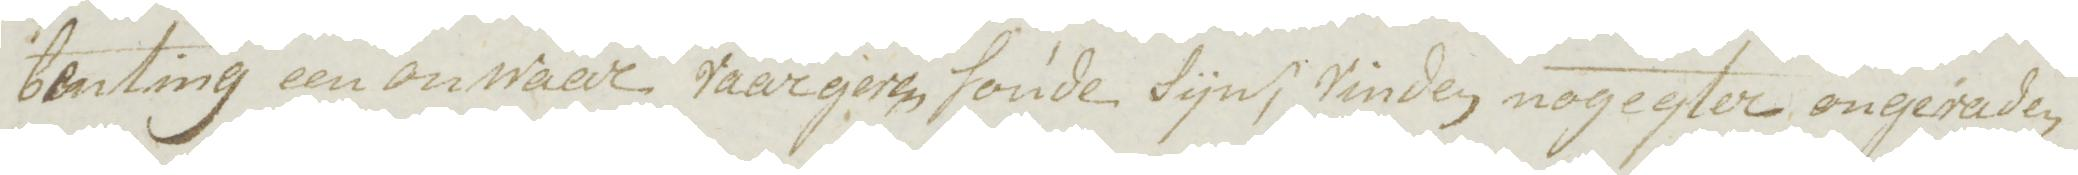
benting een onwaar vaargeren soude sijn, vinden nog egter ongeraden
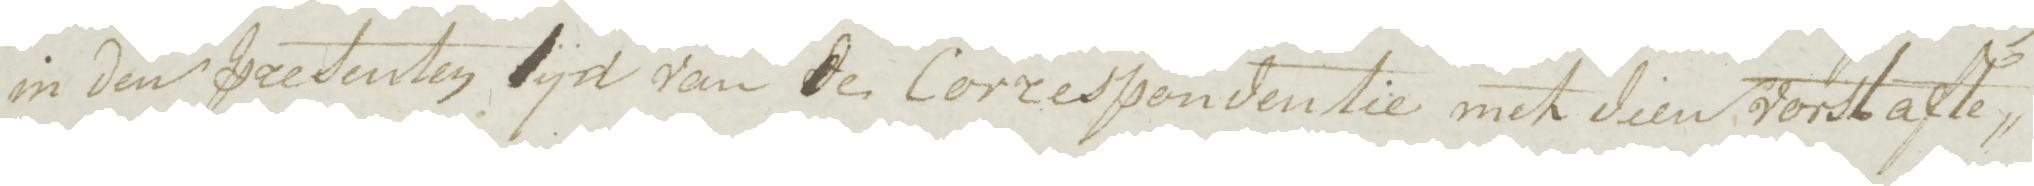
in den presenten tijd van de Correspondentie met dien vorst afte„
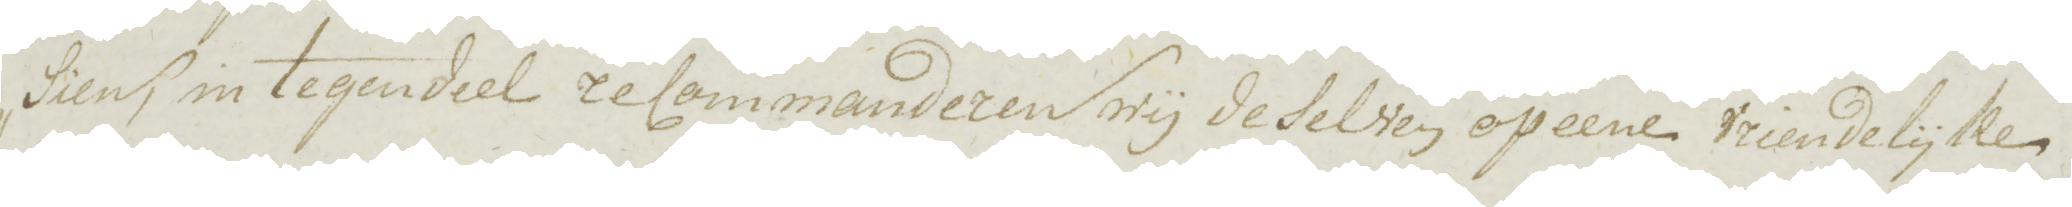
„sien, in tegendeel recommanderen wij deselven op eene vriendelijke
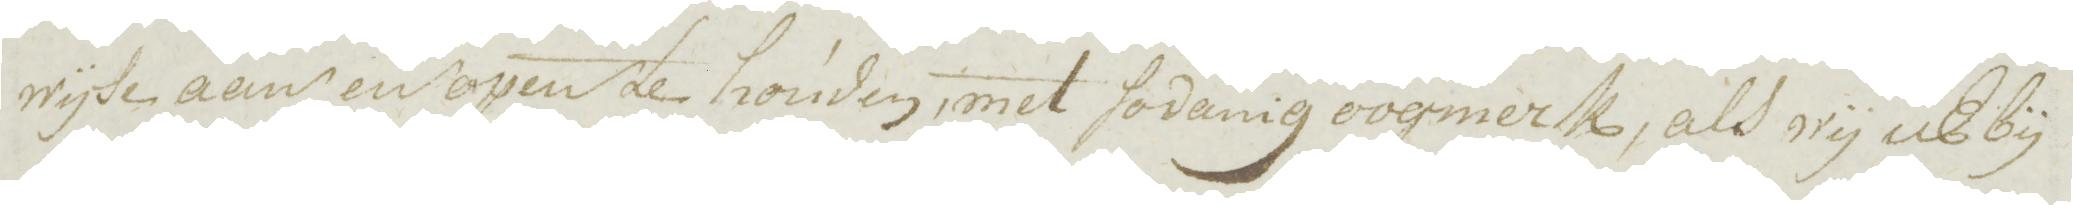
wijse aan en open te houden, met sodanig oogmerk, als wij uE bij
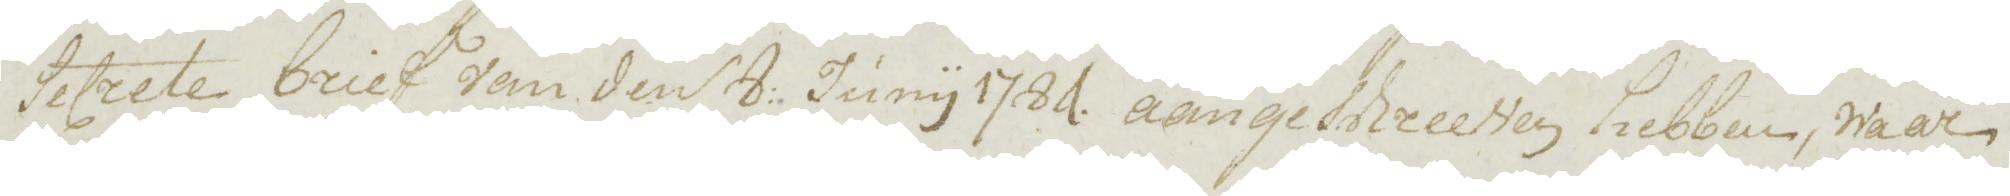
secrete brief van den 8: Junij 1784. aangeschreeven hebben, waar
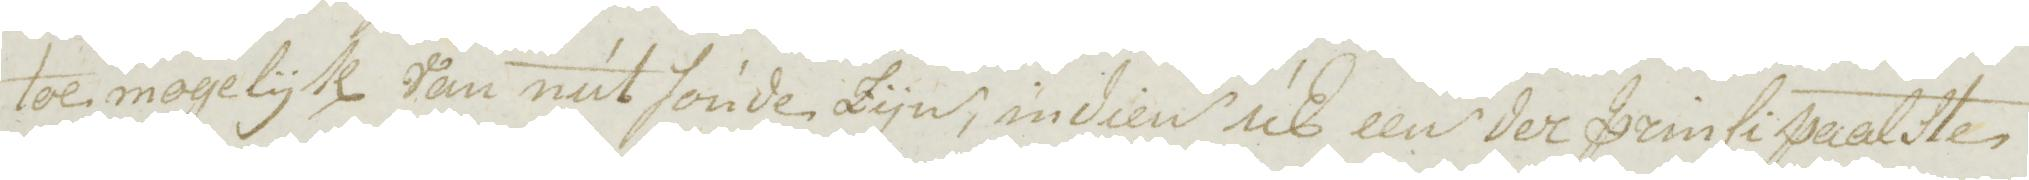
toe mogelijk van nut soude zijn, in dien uE een der principaalste
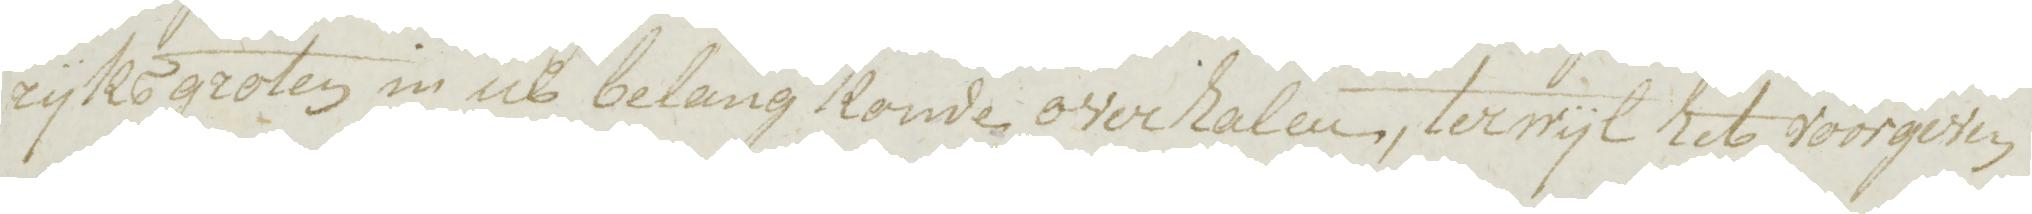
rijksgroten in uE belang konde overhalen, terwijl het voorgeven
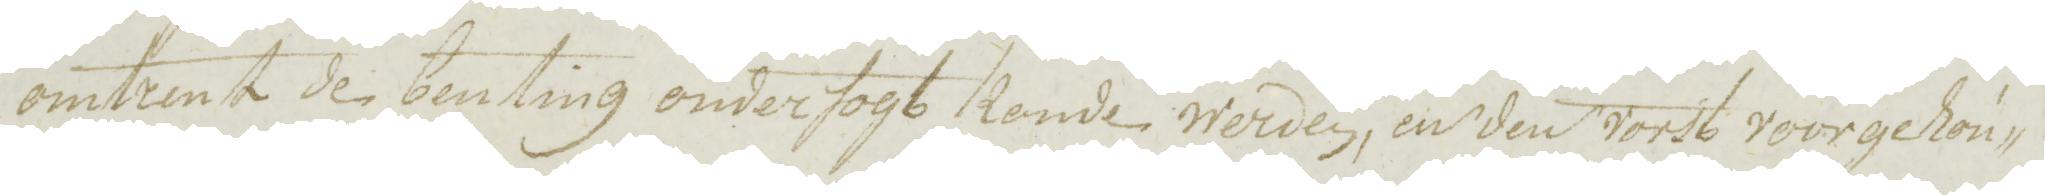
omtrent de benting ondersogt konde werden, en den vorst voorgehou„
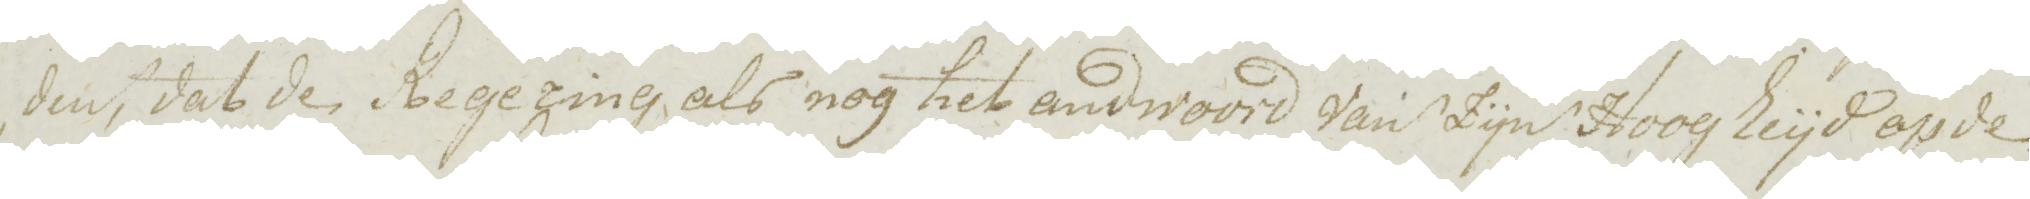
den, dat de Regering als nog het andwoord van zijn Hoogheijd op de
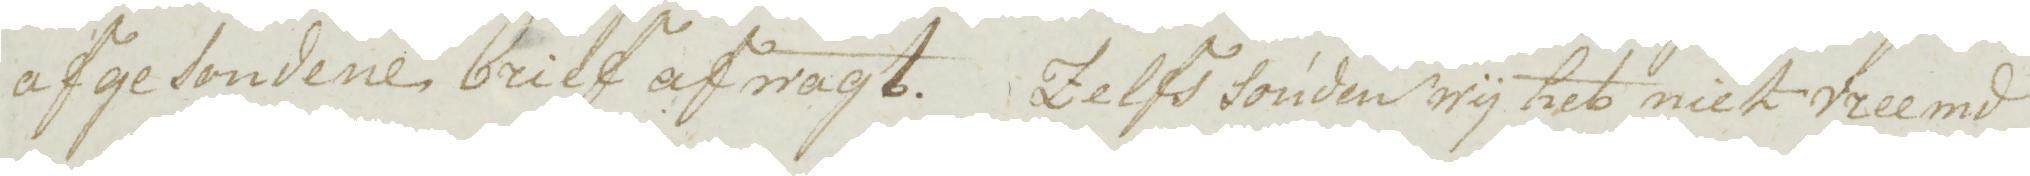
afgesondene brief af wagt. Zelfs souden wij het niet vreemd
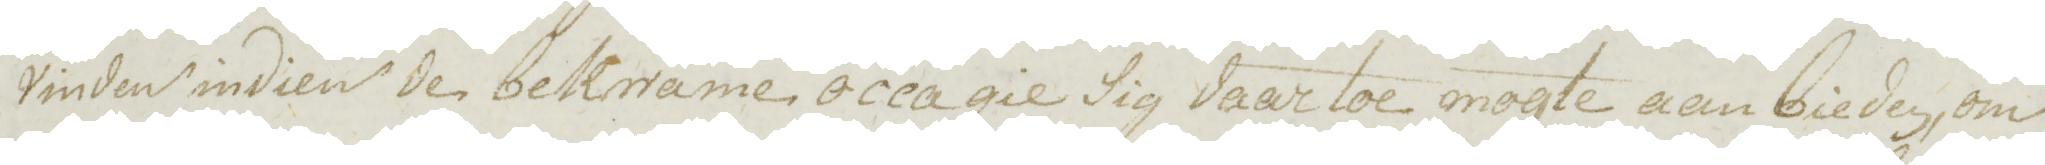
vinden indien de bekwame occagie sig daar toe mogte aan bieden, om
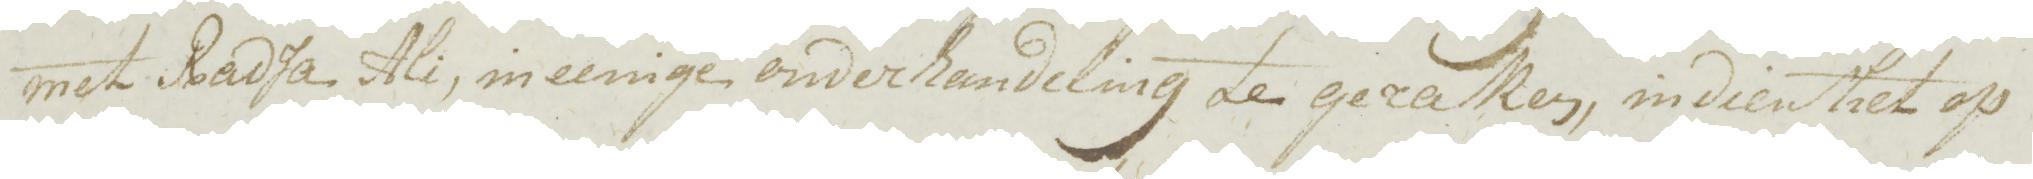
met Radja Ai, in eenige onderhandeling te geraken, indien het op
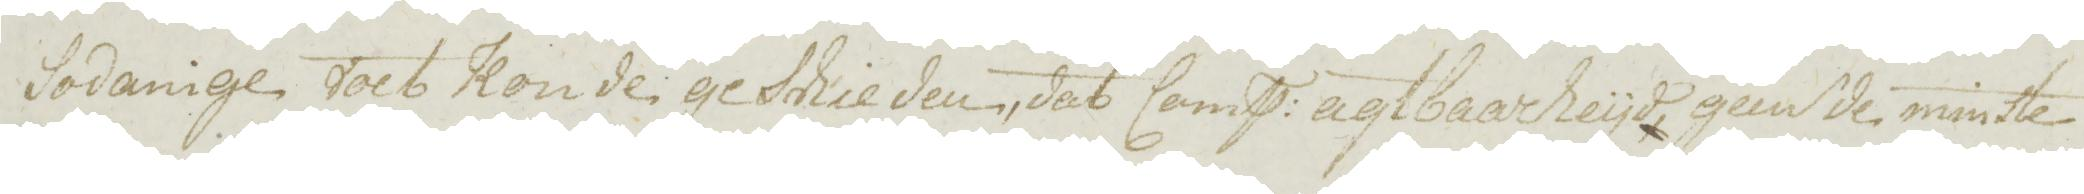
sodanige voet konde geschieden, dat Comp: agtbaarheijd, geen de minste
